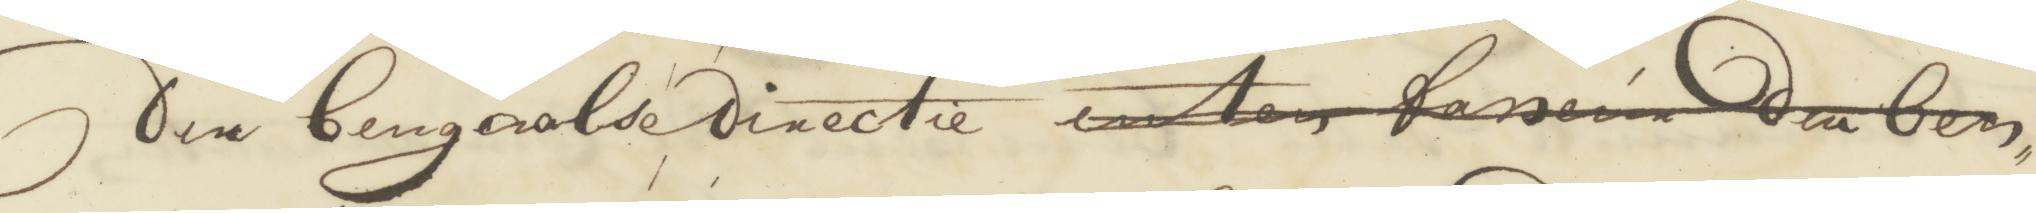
den bengaalse directie en ten faveur der ben„
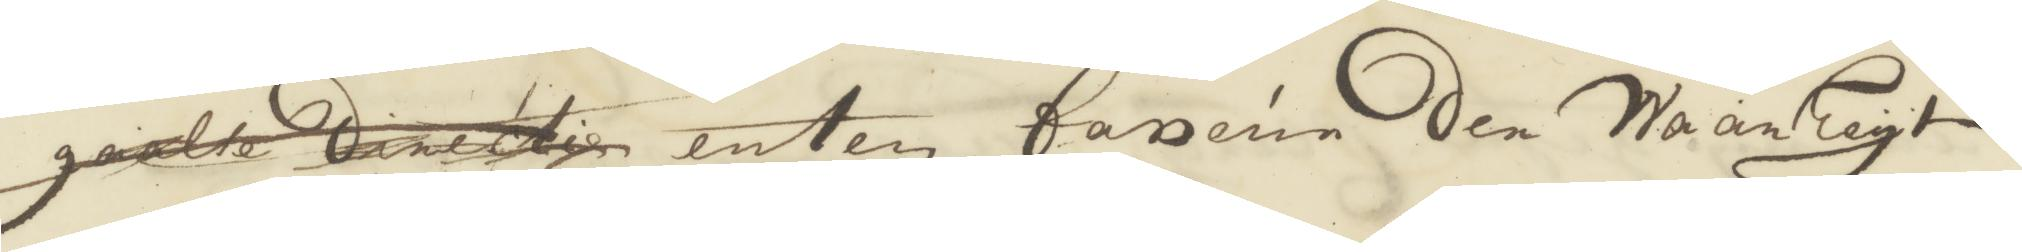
gaalse directie en ten faveur den waarheijt
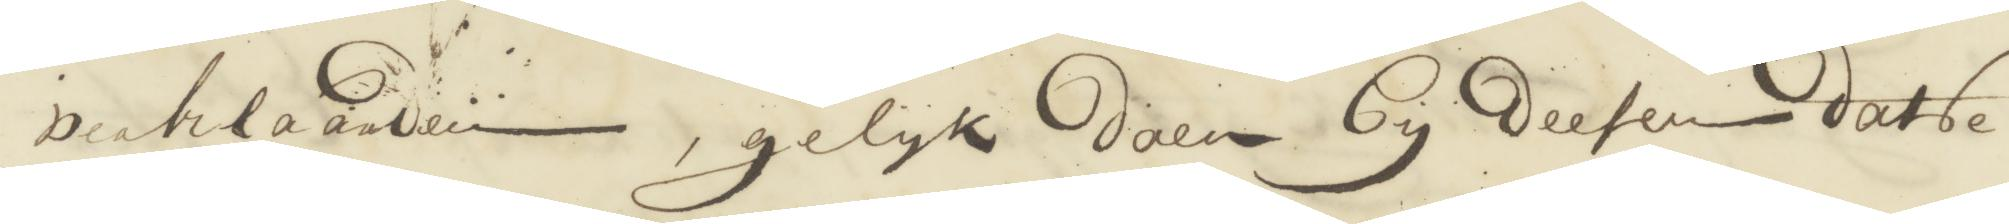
verklaarden, gelijk doen bij deesen datse
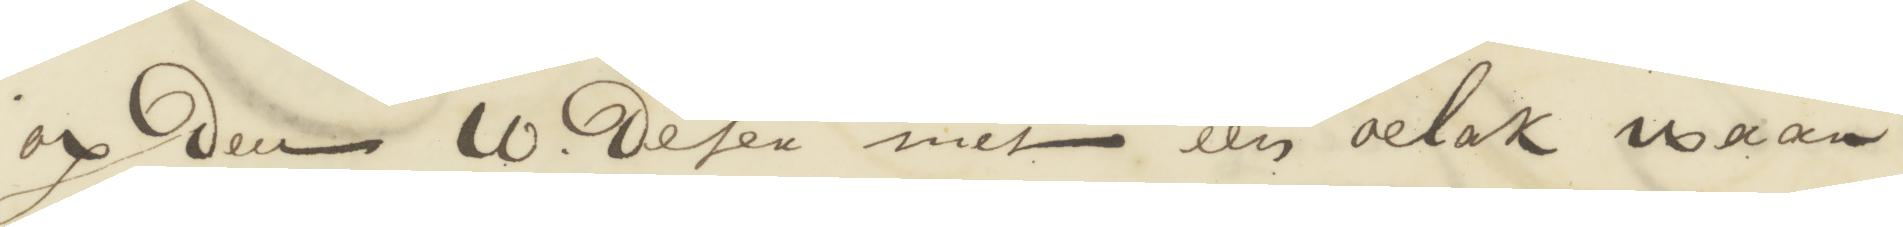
op den 10. deser met een oelak waar
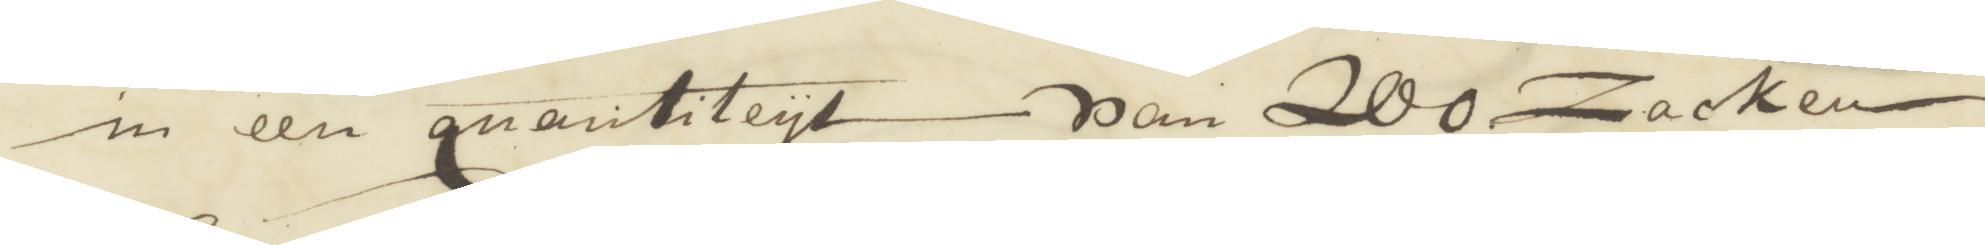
in een quantiteijt van 200. zacken
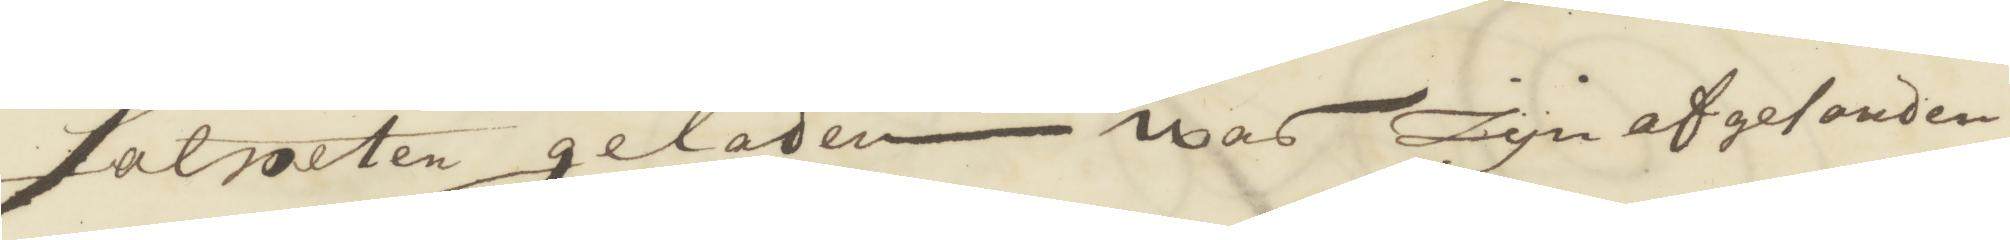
salpeter geladen was zijn afgesonden
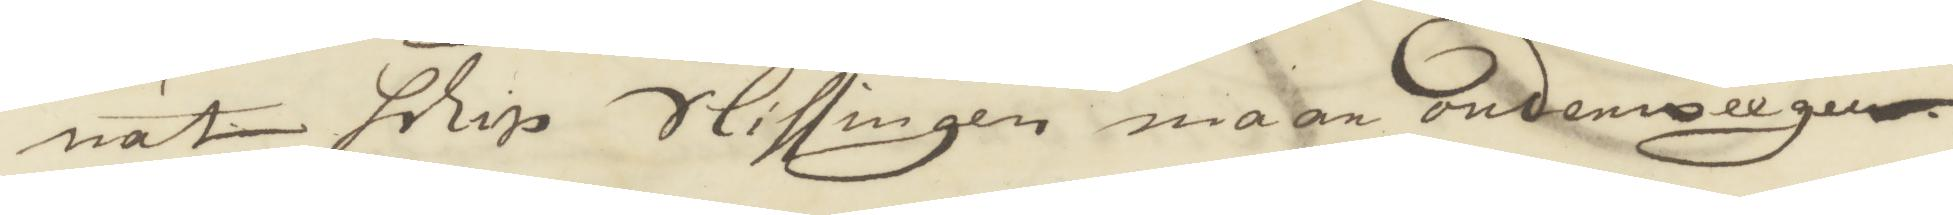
na't schip vlissingen maar onderweegen.
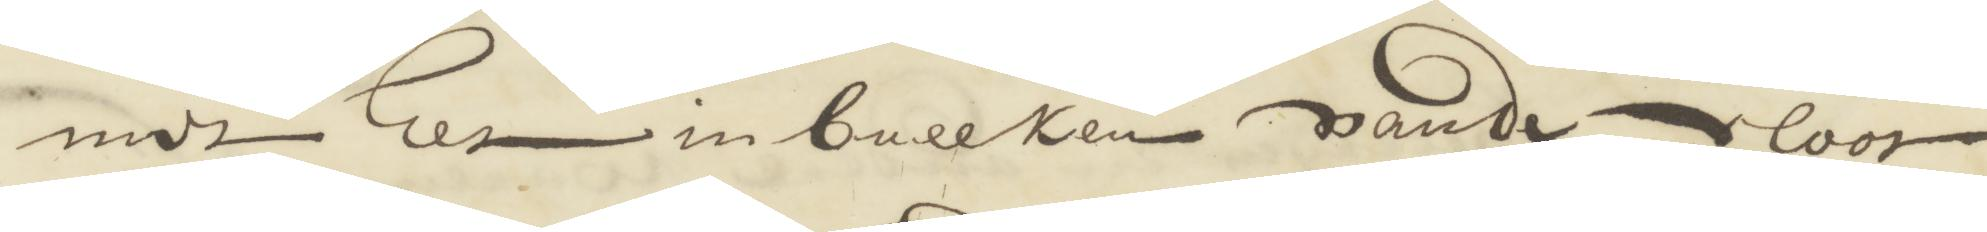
met het inbreeken vande vloot
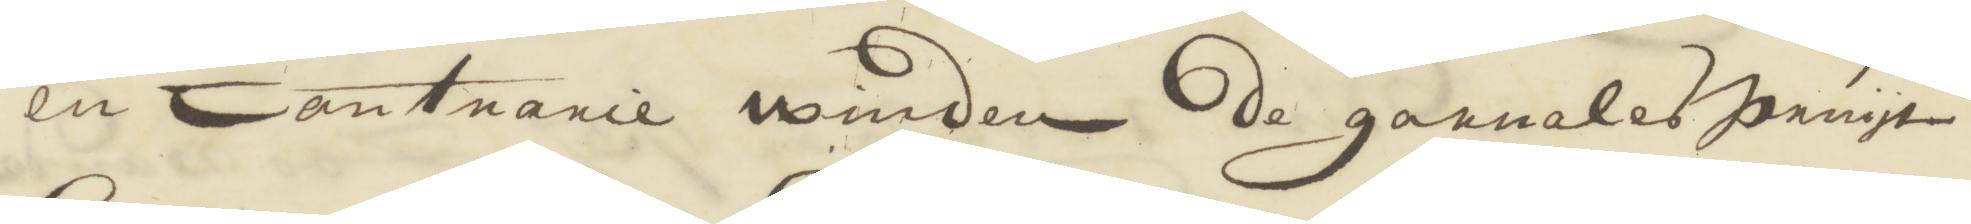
en contrarie winden de garnale spruijt
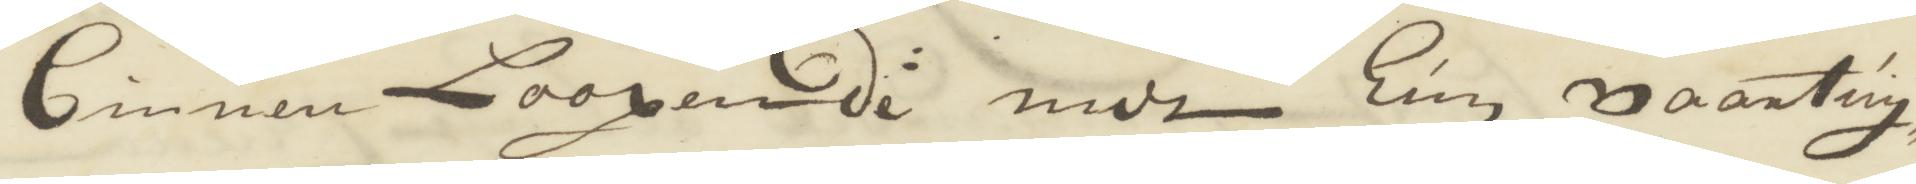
binnen Loopende met hun vaartuij„
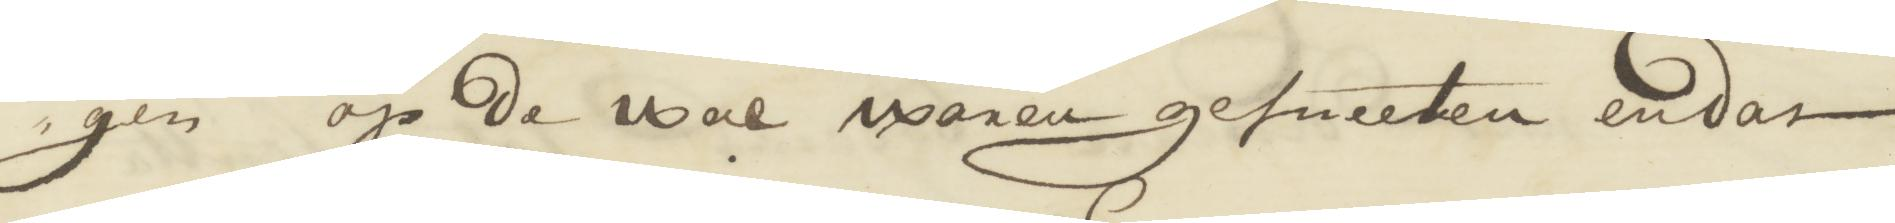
„gen op de wal waren gesneeten en dat
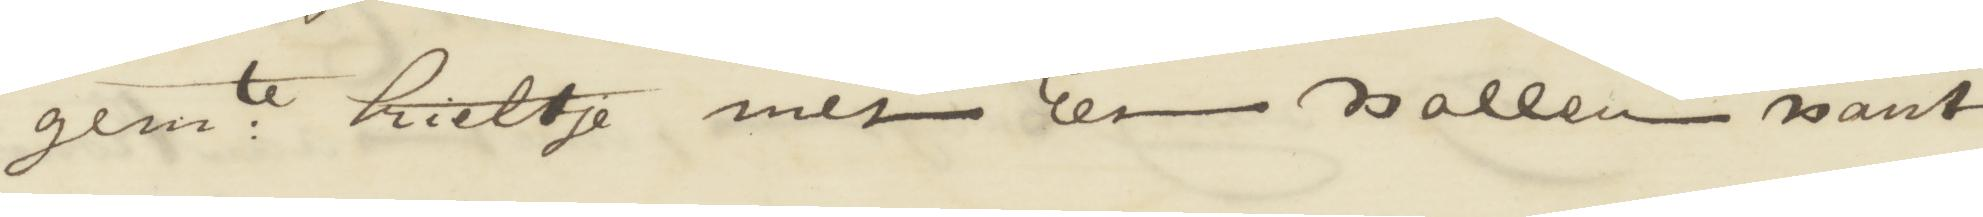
gem:te kieltje met het vallen vant
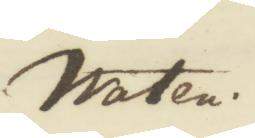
water.
